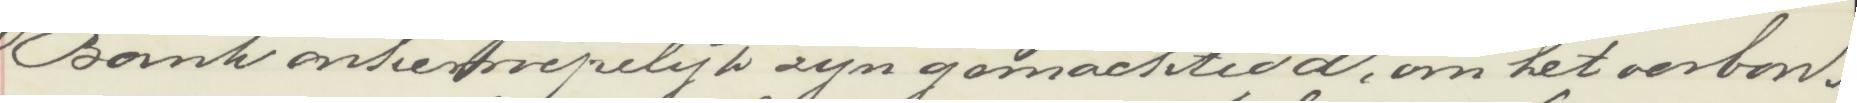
Bank onherroepelijk zijn gemachtigd, om het verbon„
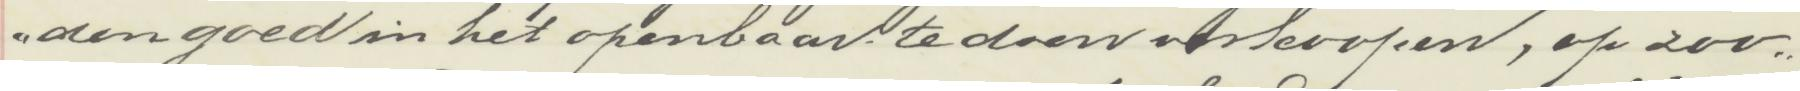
„den goed in het openbaar. te doen verkoopen, op zoo„
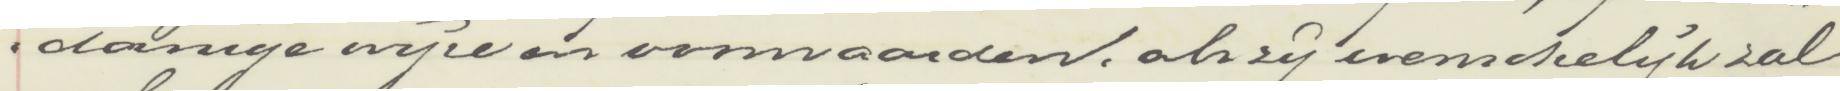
danige wijze en voorwaarden, als zij wenschelijk zal
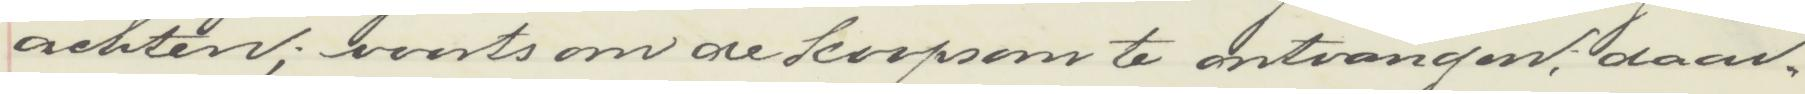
achten: voorts om de koopsom te ontvangen; daar„
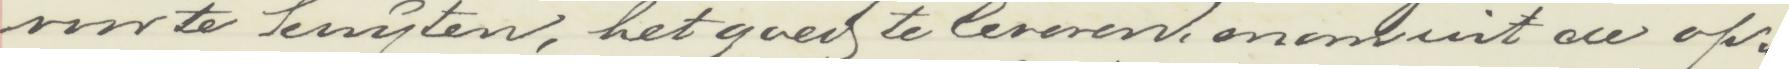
voor te kwijten, het goed te leveren, en om uit de op„
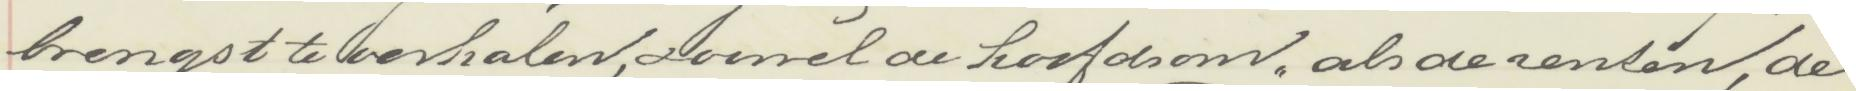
brengst te verhalen, zoowel de hoofdsom, als de renten, de
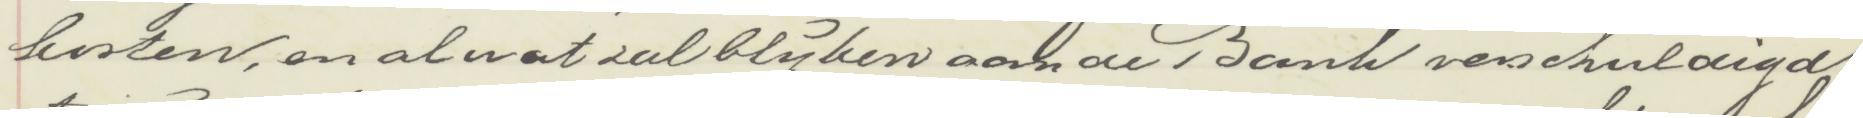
kosten, en al wat zal blijken aan de Bank verschuldigd
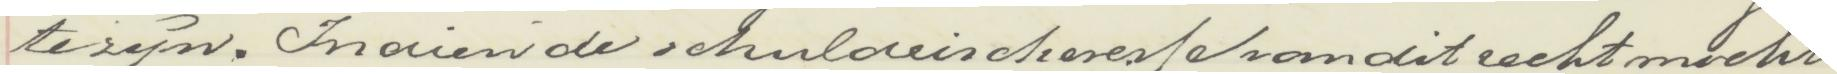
te zijn, Indien de schuldeischeresse van dit recht mocht
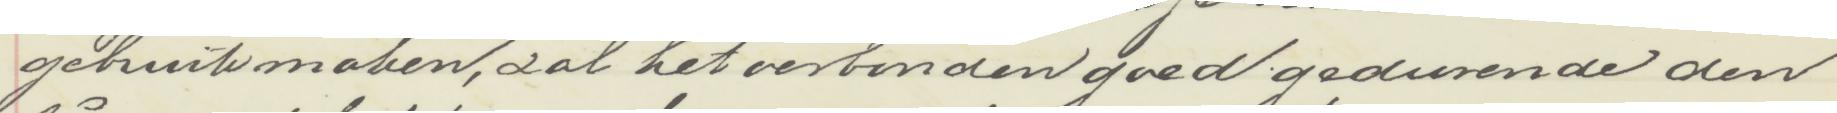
gebuikmaken, zal het verbonden goed gedurende den
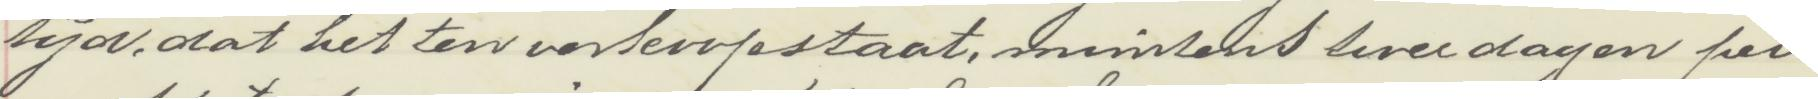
tijd, dat het ten verkoopestaat, minstens twee dagen per
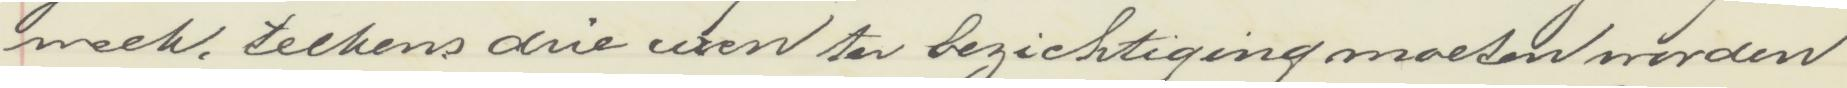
welk, teekens drie uren ter bezichtiging moeten worden
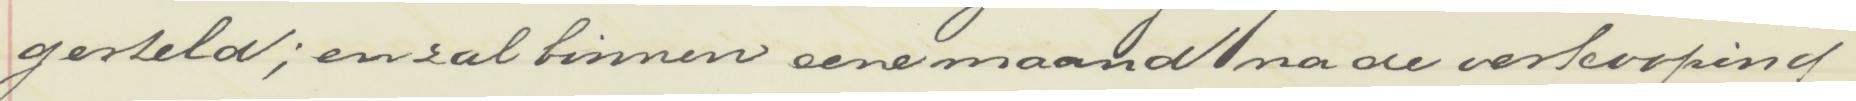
gesteld; en zal binnen eene maand na de verkooping
